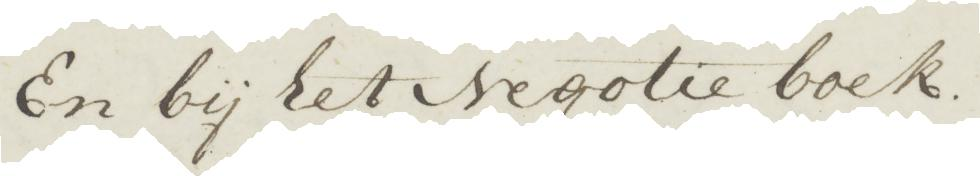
En bij het Negotie boek.
